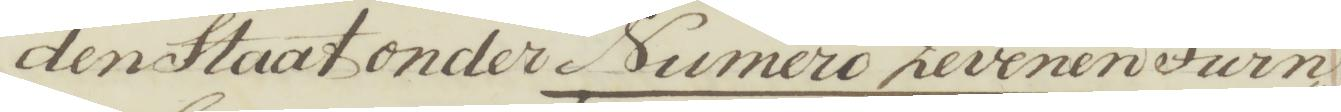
den Staat onder Numero Zevenen Twin
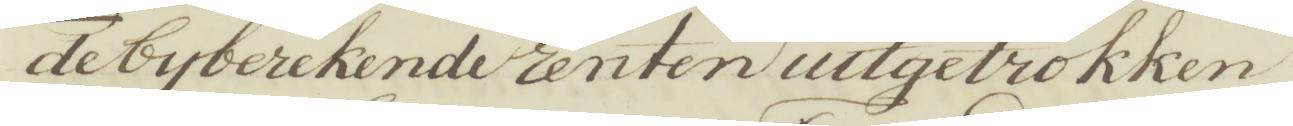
de byberekende renten uitgetrokken
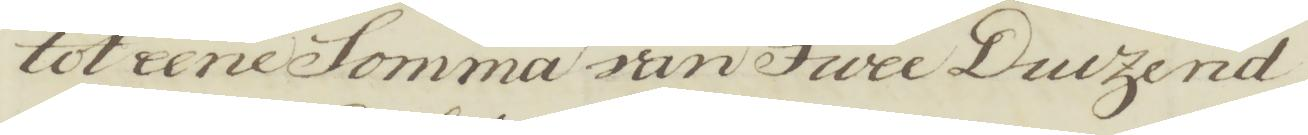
tot eene Somma van Twee Duizend
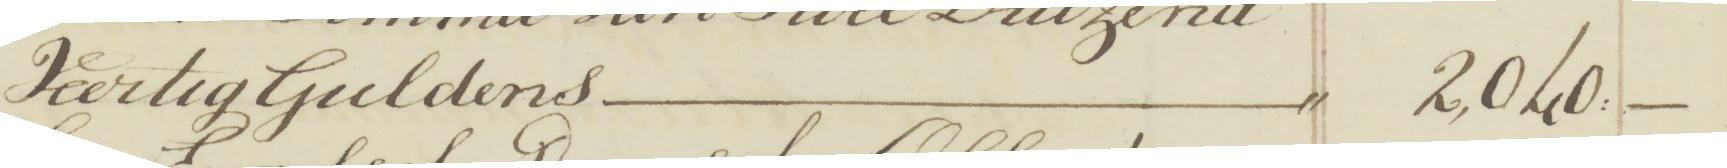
Veertig Guldens— „ 2,040:—
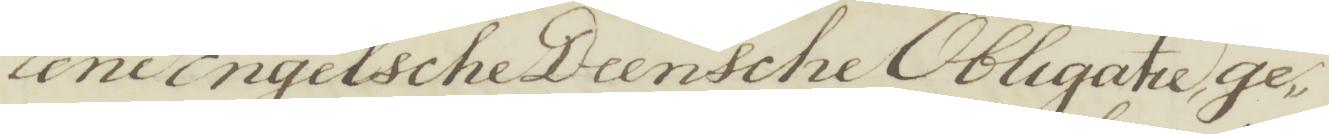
Eene Engelsche Deensche Obligatie, ge„
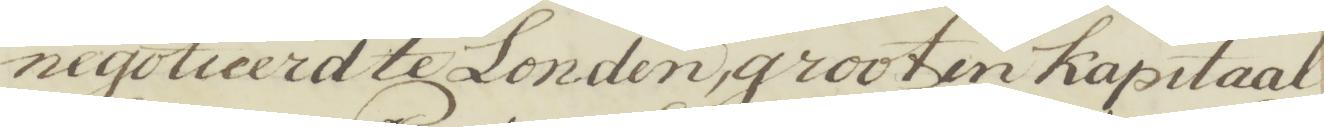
negotieerd te Londen, groot in kapitaal
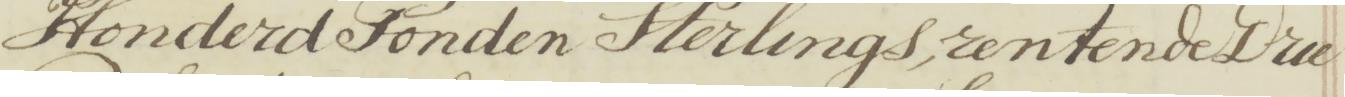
Honderd Ponden Sterlings, rentende Drie
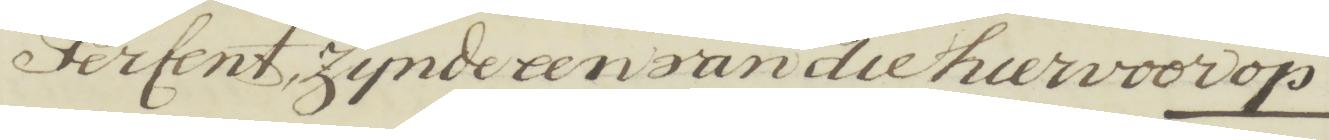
Percent, zynde een van die hiervoor op
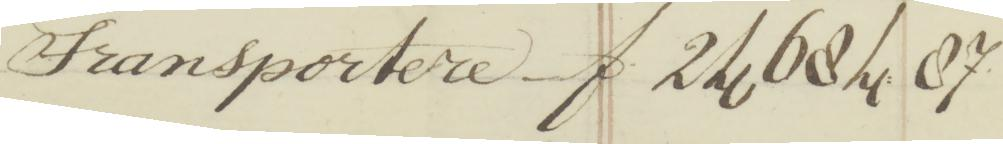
Transportere -ƒ 24,684: 87.
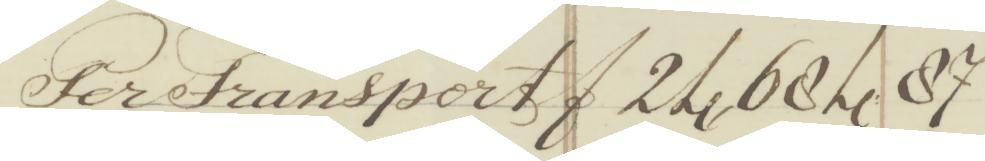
Per Transport ƒ 24,684: 87
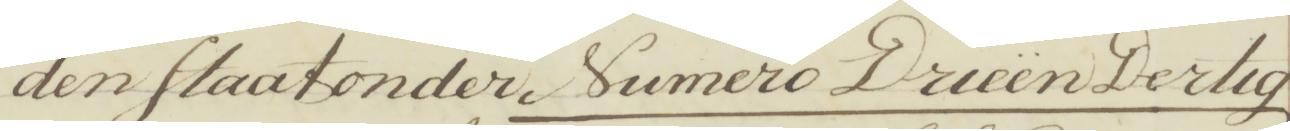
den Staat onder Numero Drieen Dertig
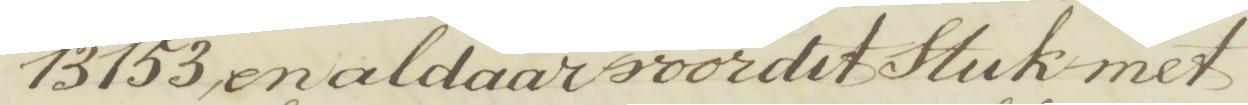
13153, en aldaar voor dit Stuk met
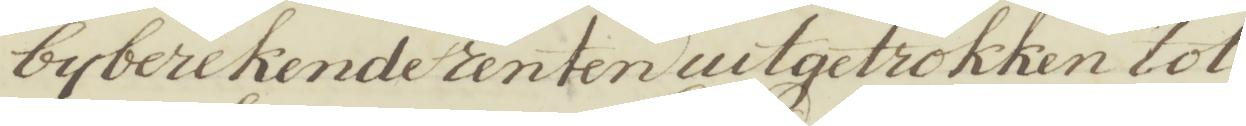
byberekende renten uitgetrokken tot
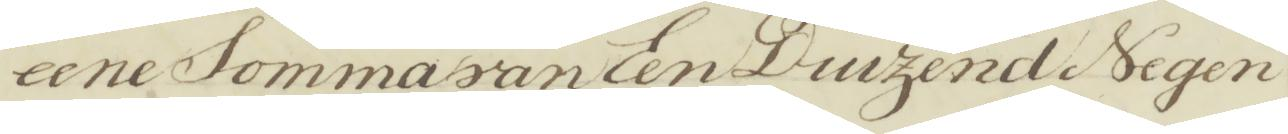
eene Somma van Een Duizend Negen
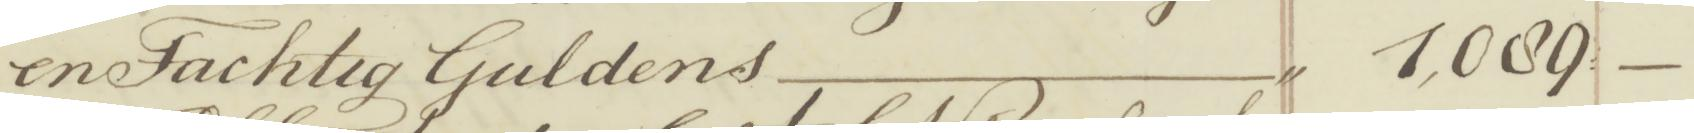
en Tachtig Guldens — „ 1,089: —
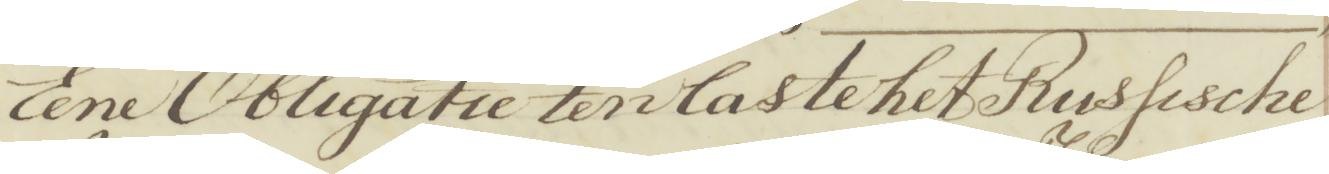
Eene Obligatie ten laste het Russische
